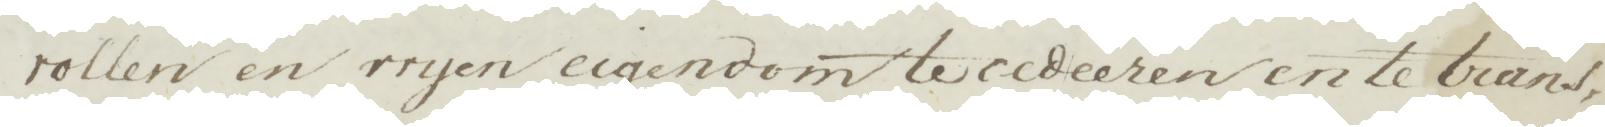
vollen en vryen eigendom te cedeeren en te trans„
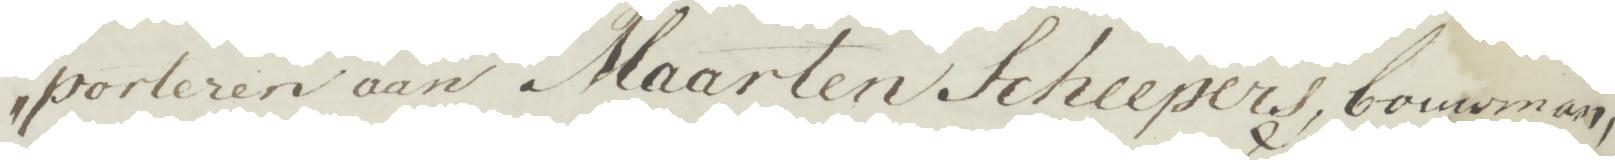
„porteren aan Maarten Scheepers, bouwman,
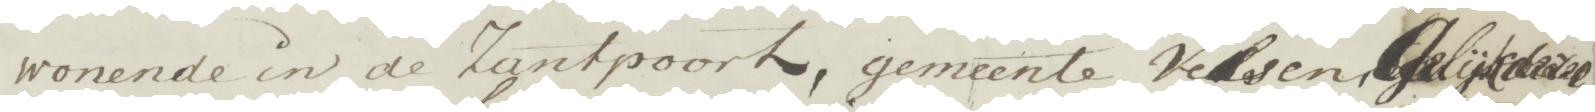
wonende in de Zantpoort, gemeente Velsen, Gelijk deze
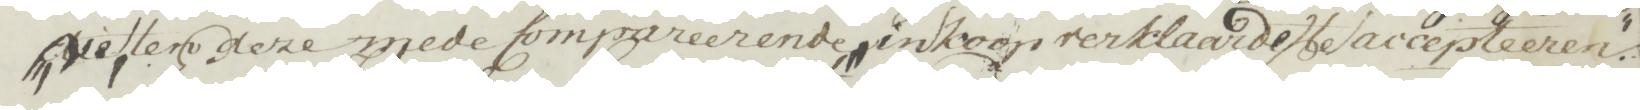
vellen deze mede Compareerende, in koop verklaarde te accepteeren.
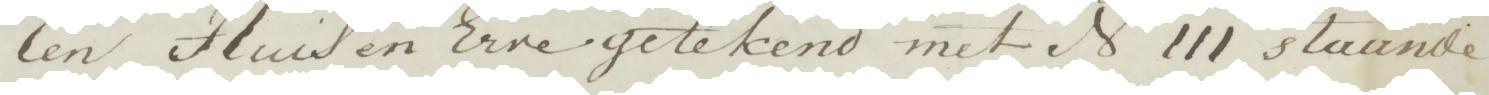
Een Huis en Erve getekend met N 111 staande
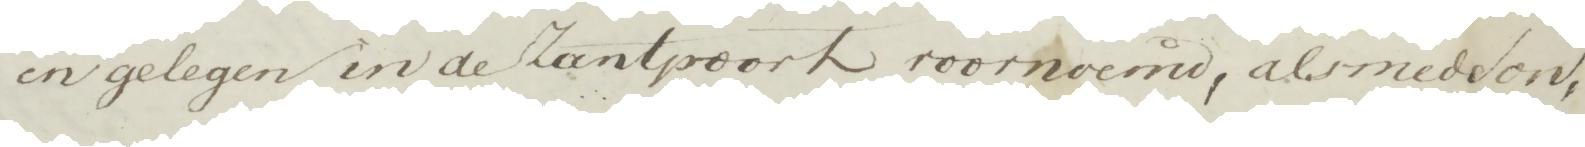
en gelegen in de Zantpoort voornoemd, als mede on„
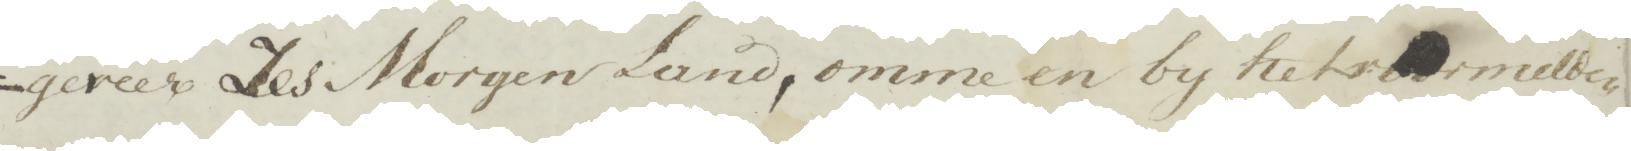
=geveer Zes Morgen Land, omme en by het vermelde„
